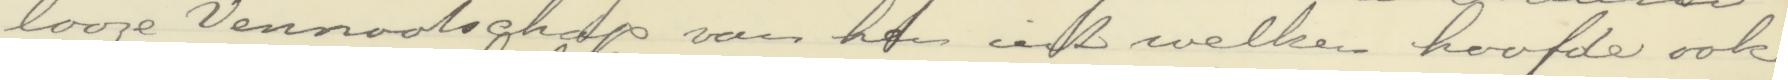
looze vennootschap van hen uit welken hoofde ook
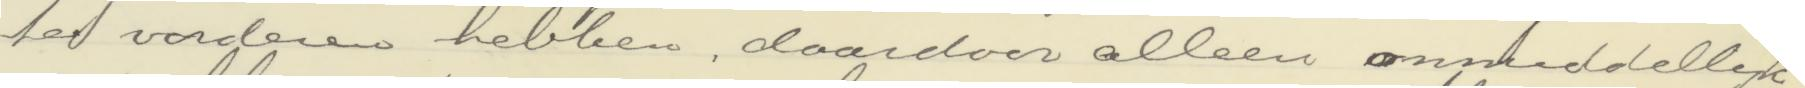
te vorderen hebben, daardoor alleen onmmiddellyk
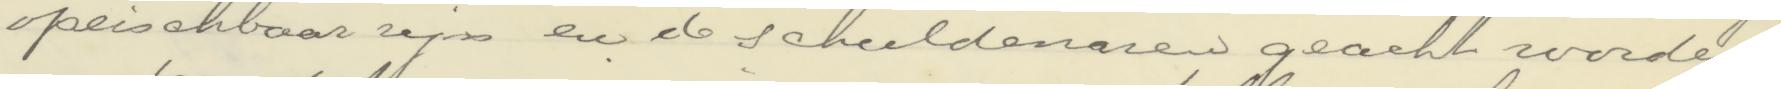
opeischbaar zyn en de schuldenaren geacht worden
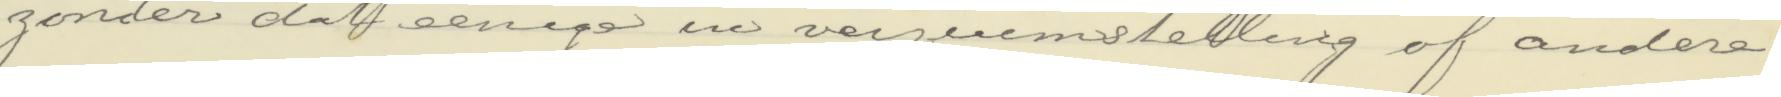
zonder dat eenige in verzuimstelling of andere
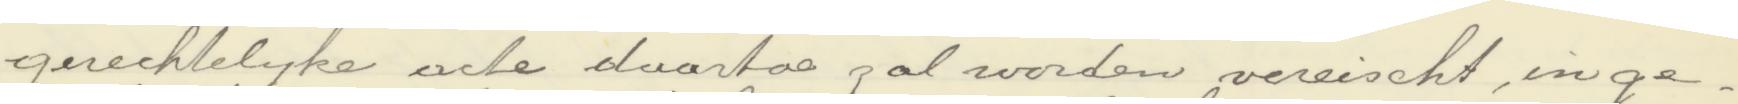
gerechtelyke acte daartoe zal worden vereischt, in ge-
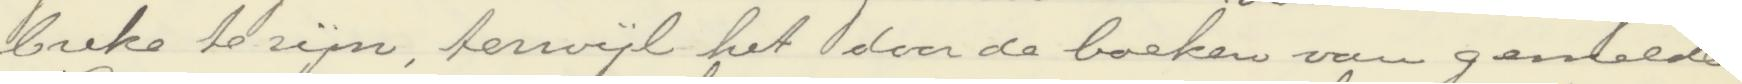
breke te zijn, terwijl het door de boeken van gemelde
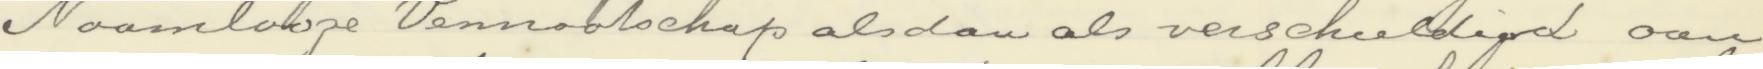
Naamlooze Vennootschap als dan als verschuldigd aan
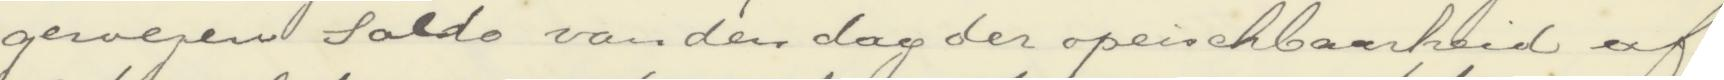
geroepen Saldo van den dag der opeischbaarheid af
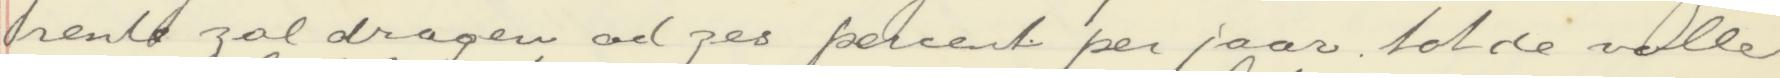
rente zal dragen ad zes percent per jaar, tot de volle
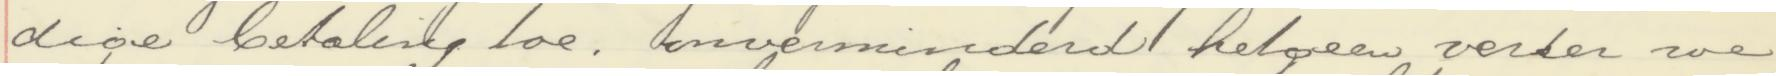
dige betaling toe, onverminderd hetgeen verder we
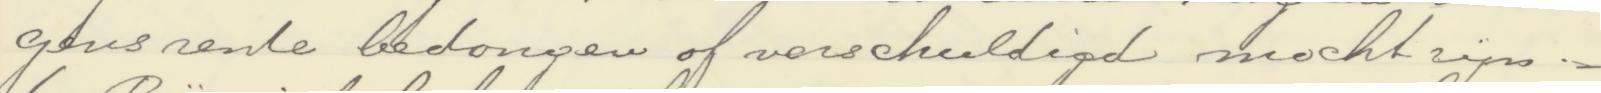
gens rente bedongen of verschuldigd mocht zijn.
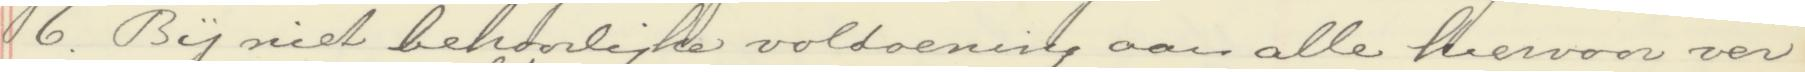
6. Bij niet behoorlijke voldoening aan alle hiervoor ver
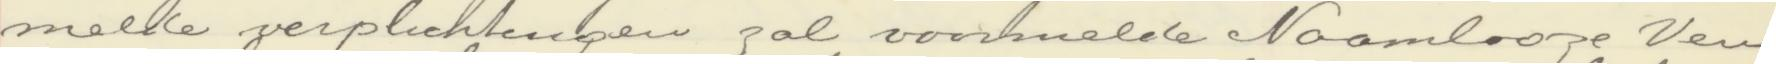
melde verplichtingen zal voormelde Naamlooze Ven
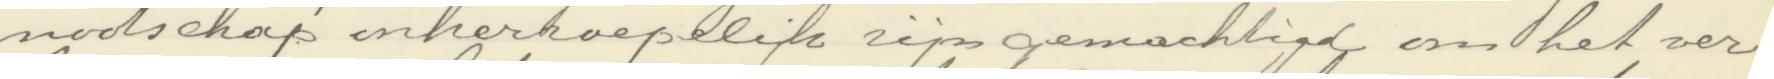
nootschap onherroepelik zijn gemachtigd om het ver
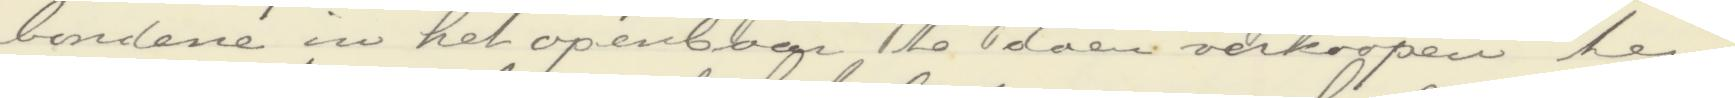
bondene in het openbaar te doen verkoopen ten
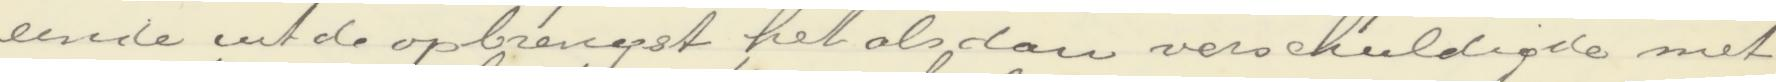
einde uit de opbrengst het als dan verschuldigde met
